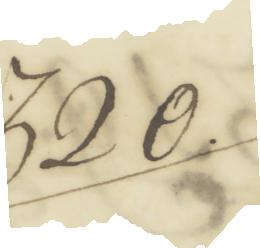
320.
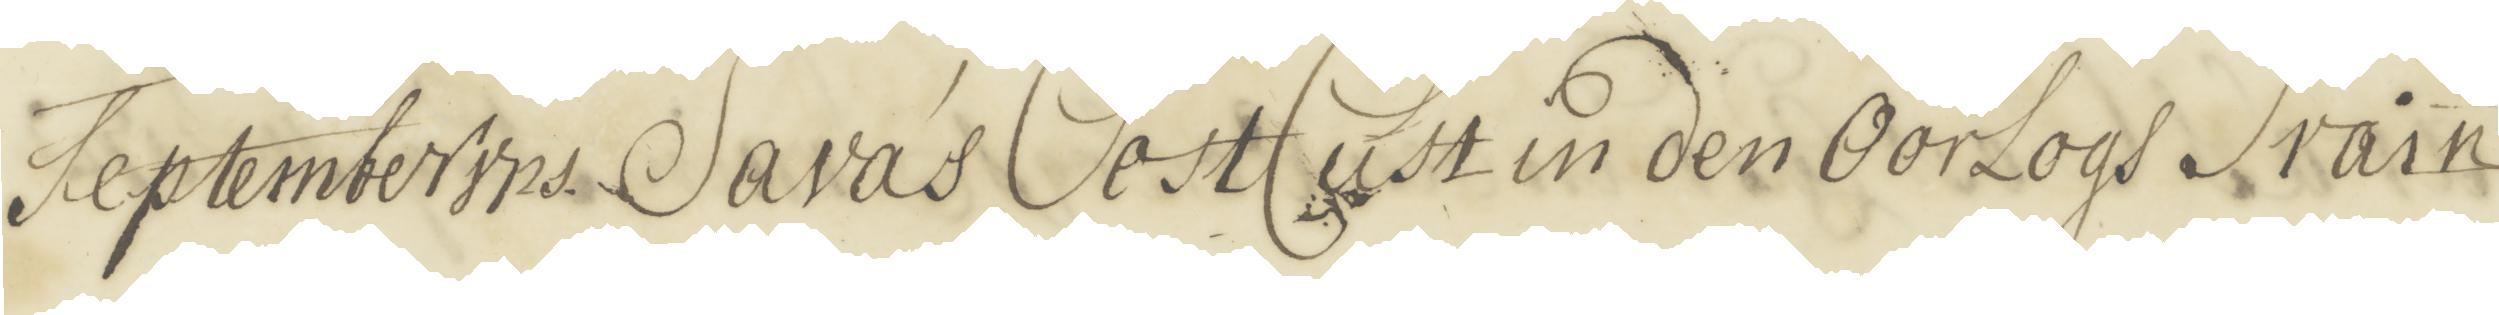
September 1721. Iava's Oost Cust in den Oorlogs Train
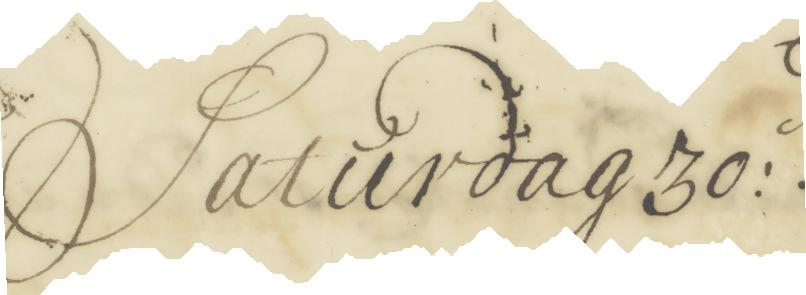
Saturdag 30:'
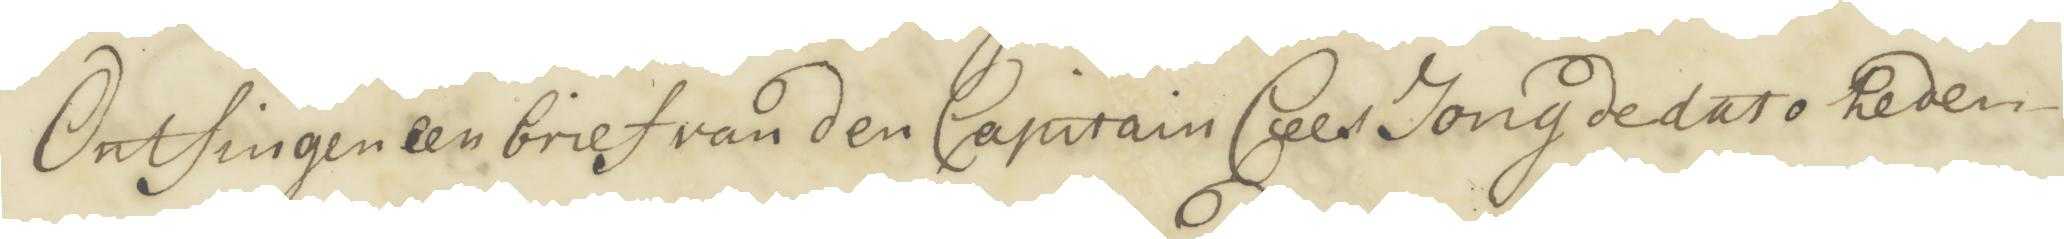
Ontfingen een brief van den Capitain Cees Iong de dato heden
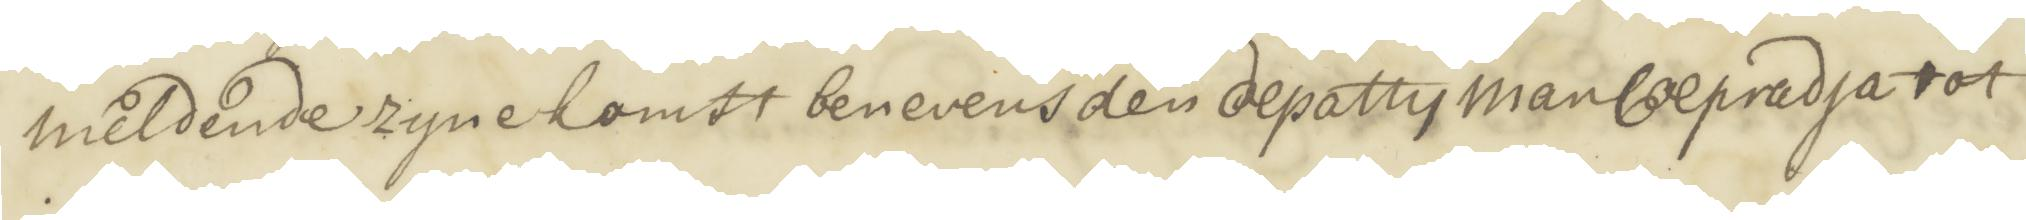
meldende zyne komst benevens den depatty man Coepradja tot
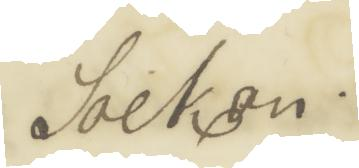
soekan.
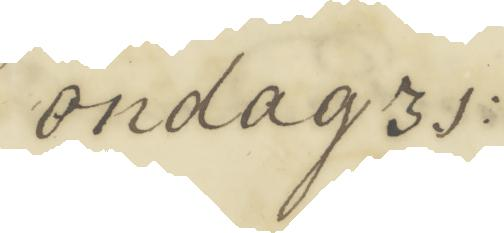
Zondag 31:
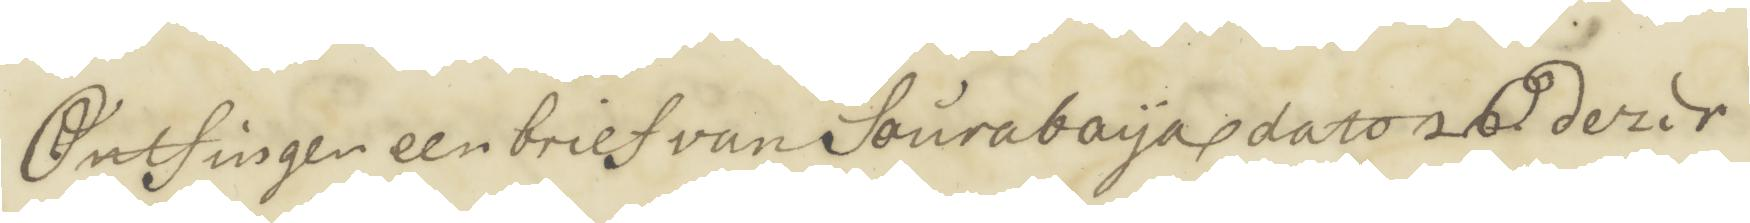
Ontfingen een brief van Sourabaija dato 26. dezer
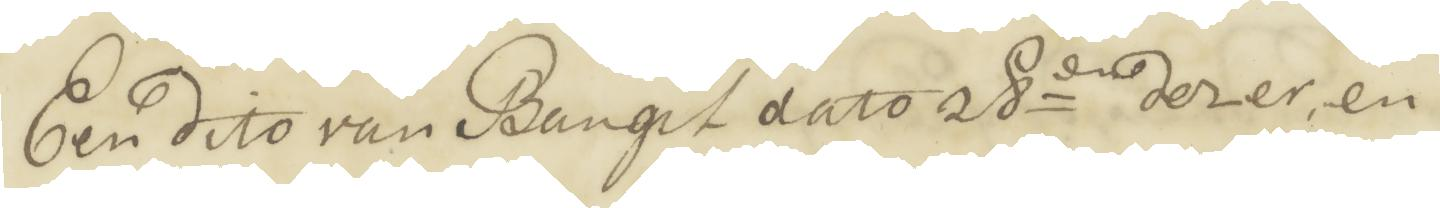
Een dito van Bangit dato 28=en dezer, en
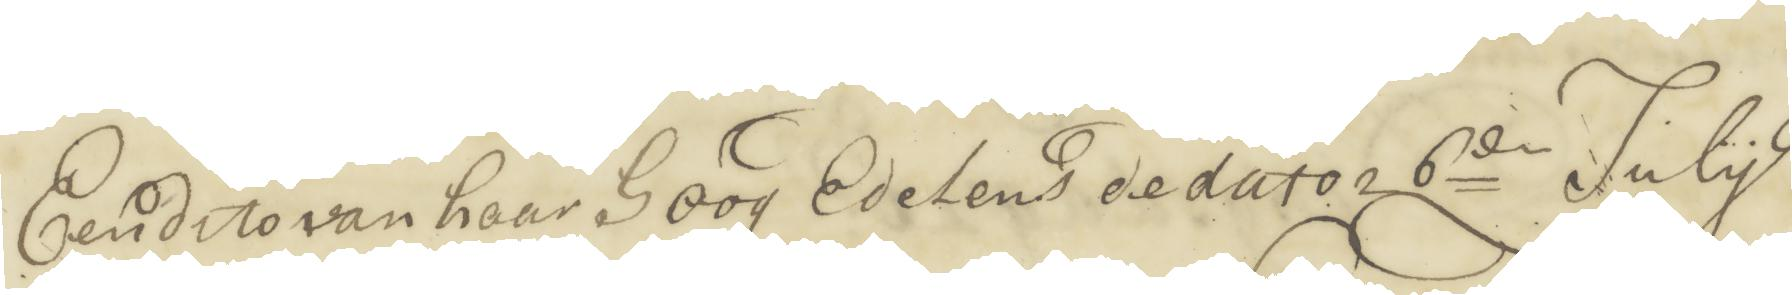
Een dito van haar Hoog Edelens de dato 26=en Iulij
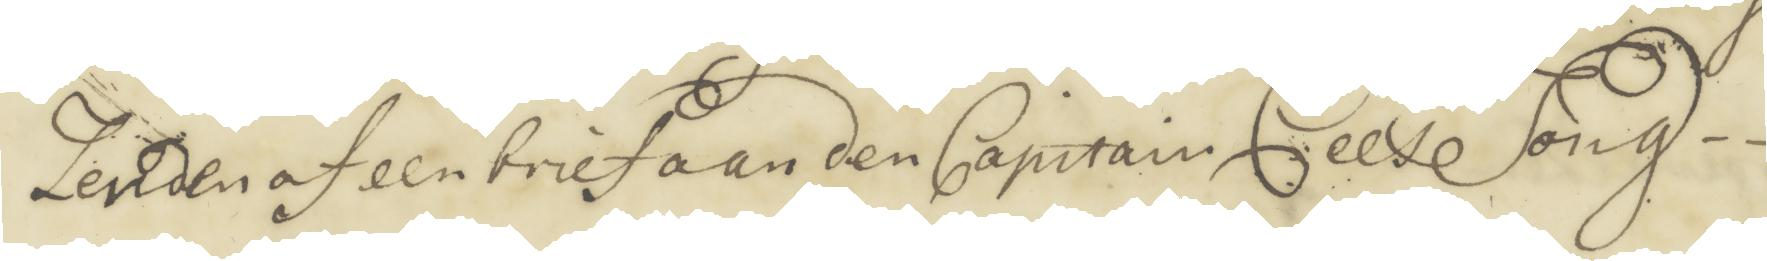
Zenden af een brief aan den Capitain Cees Iong — —
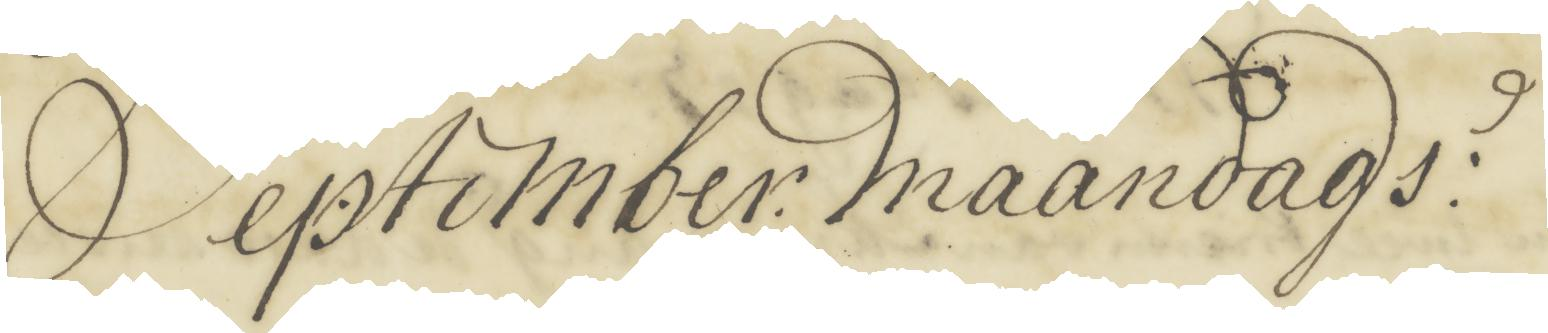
September Maandags:'
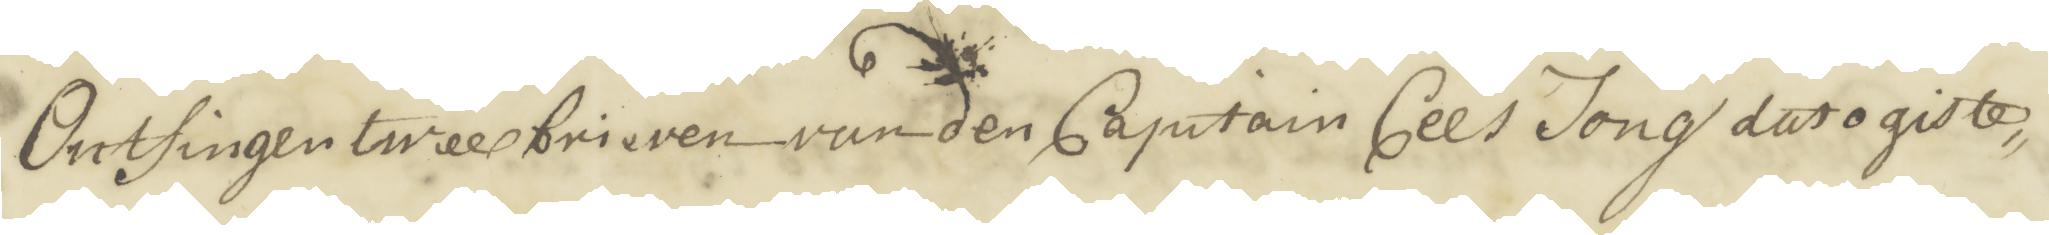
Ontfingen twee brieven van den Capitain Cees Iong dato giste„
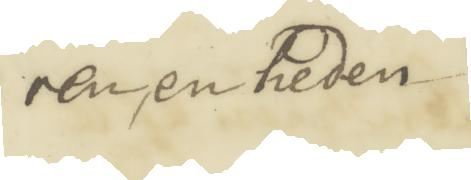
ren, en heden
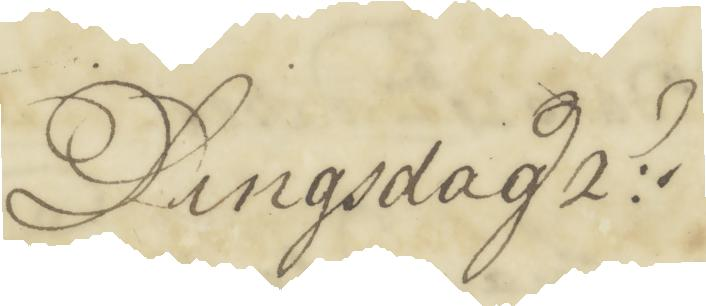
Dingsdag 2:'
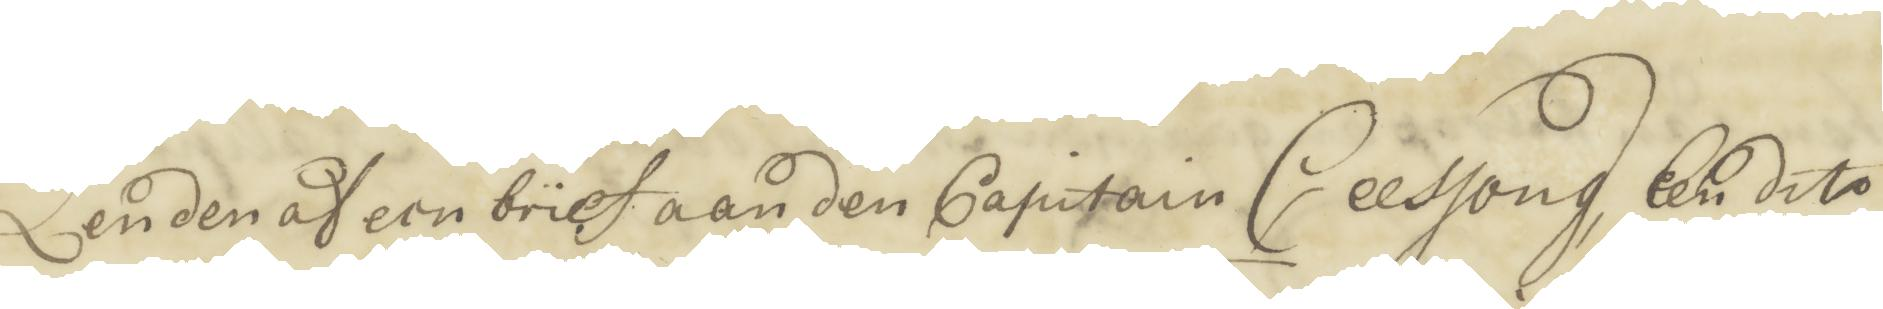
Zenden af een brief aan den Capitain Ceesjong Een dito
